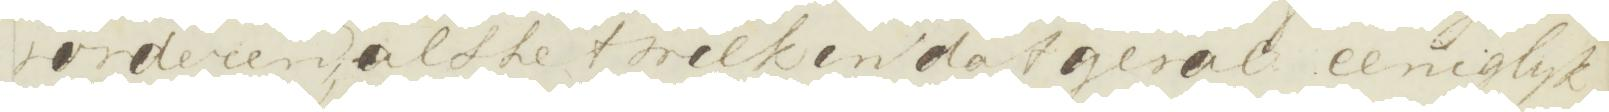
vorderen, als het welken dat geval eeniglijk
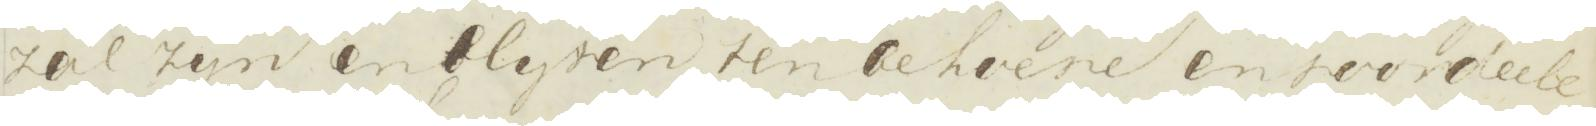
zal zyn en blyven ten behoeve en voordeele
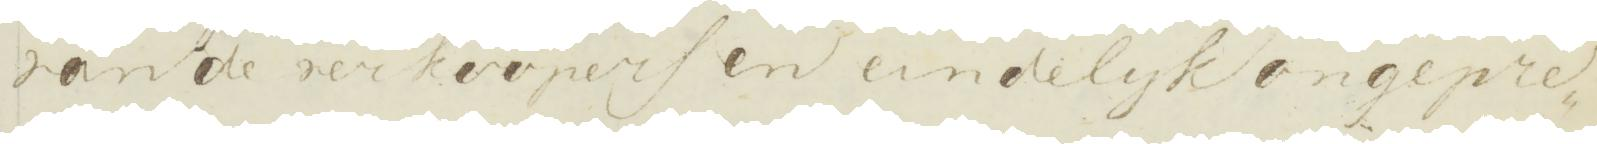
van de verkoopers en eindelyk ongepre„
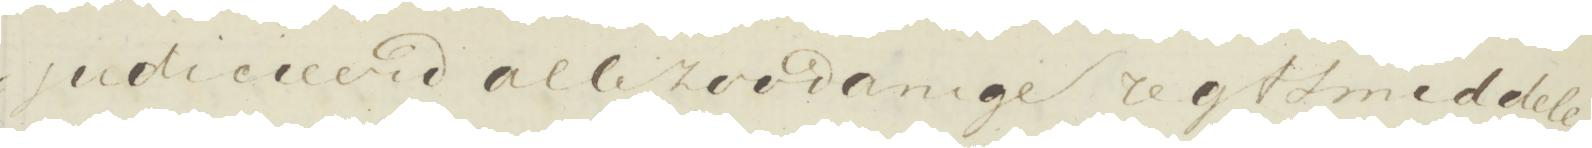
„judicieerd alle zoodanige regtsmiddelen
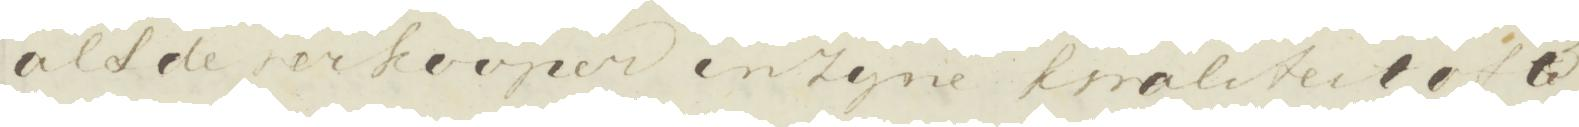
als de verkooper in zyne kwaliteit of te
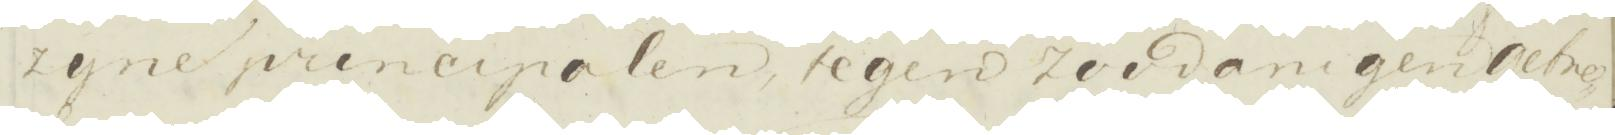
zyne principalen, tegen zoodanigen gebre„
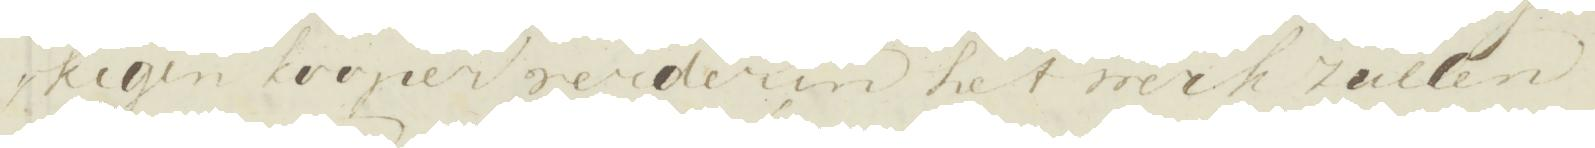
„kigen kooper verder in het werk zullen
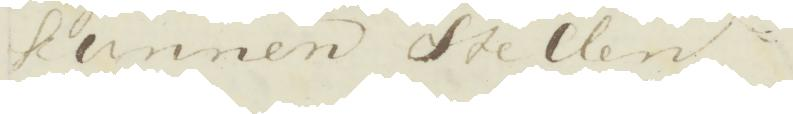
kunnen stellen.
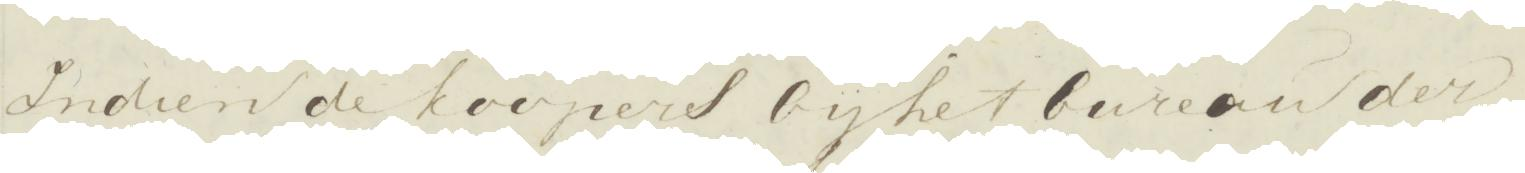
Jndien de koopers by het bureau der
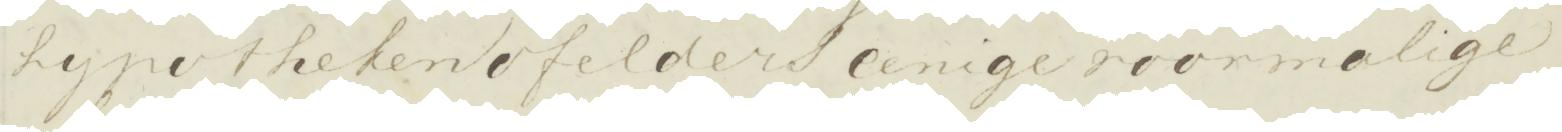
hypotheken of elders eenige voormalige
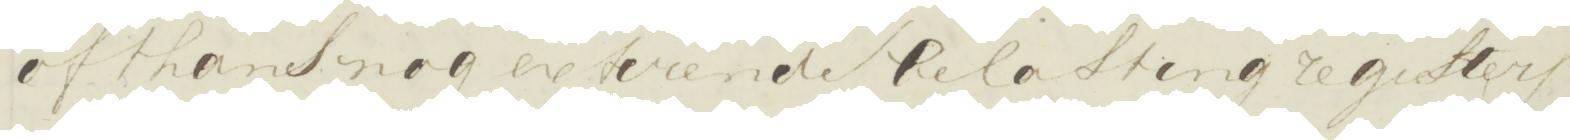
of thans nog exterende belasting registers
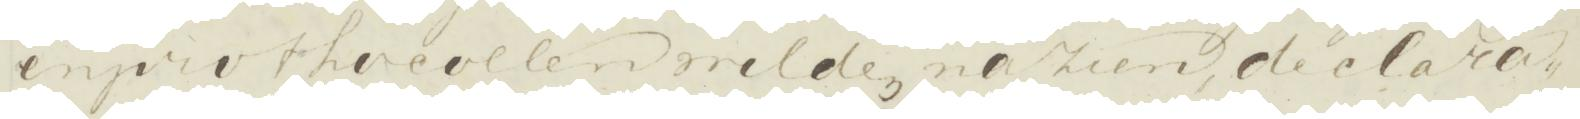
en prothocollen wilden na zien, declara„
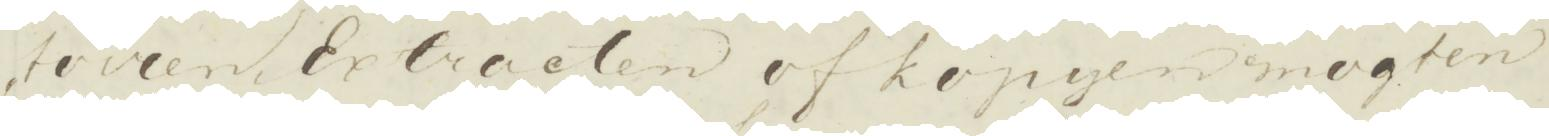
„toiren, Extracten of kopyen mogten
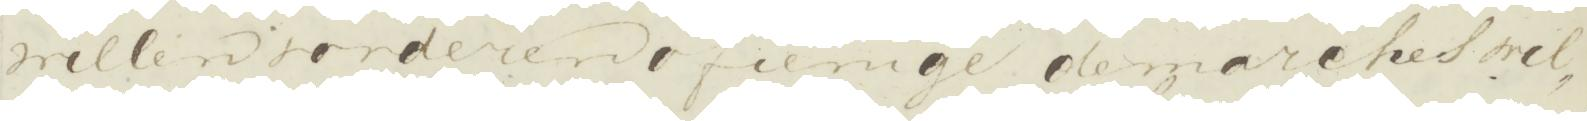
willen vorderen of ienige demarches wil„
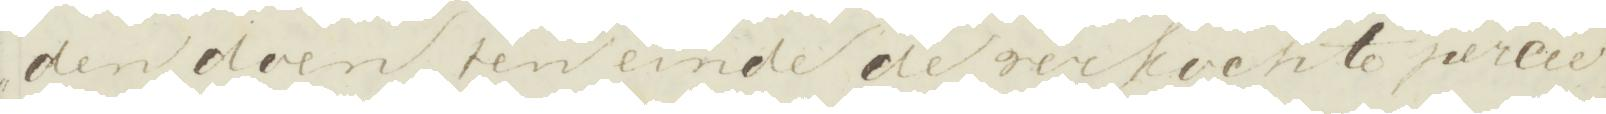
„den doen ten einde de verzochte percee
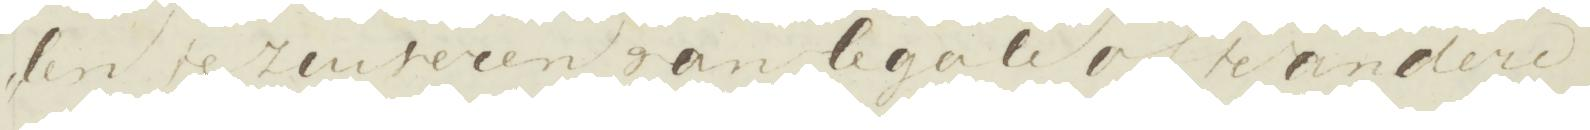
„len te zuiveren van legale of te andere
